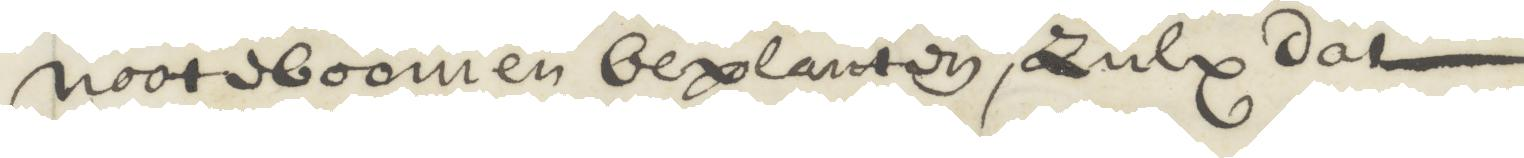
nooteboomen beplanten, zulx dat
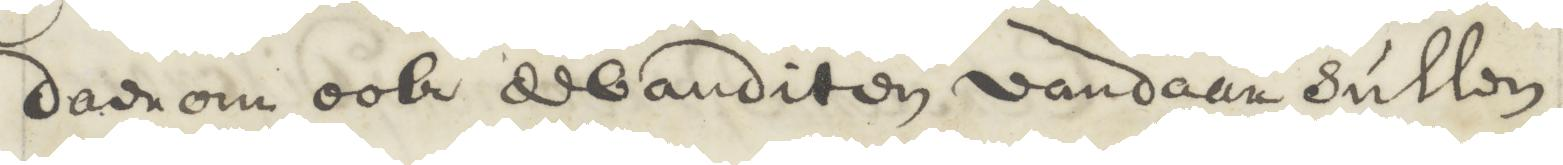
daerom ook debanditen vandaar sullen
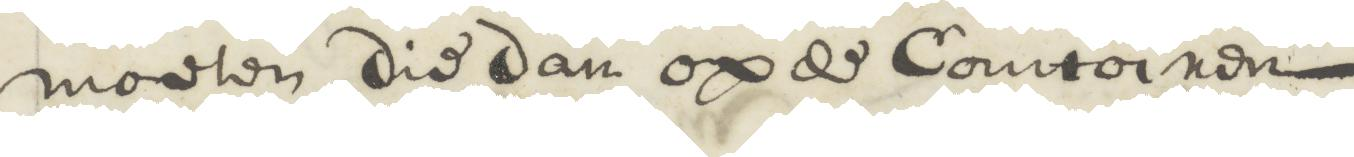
moeten, die dan op de Comtoiren
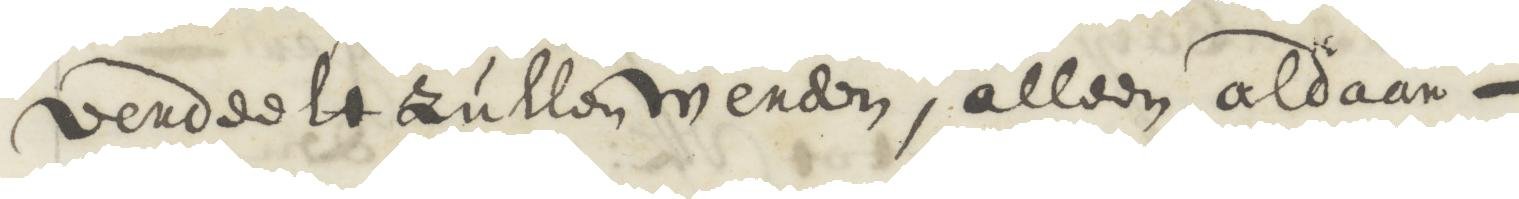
verdeelt zullen werden, alleen aldaar —
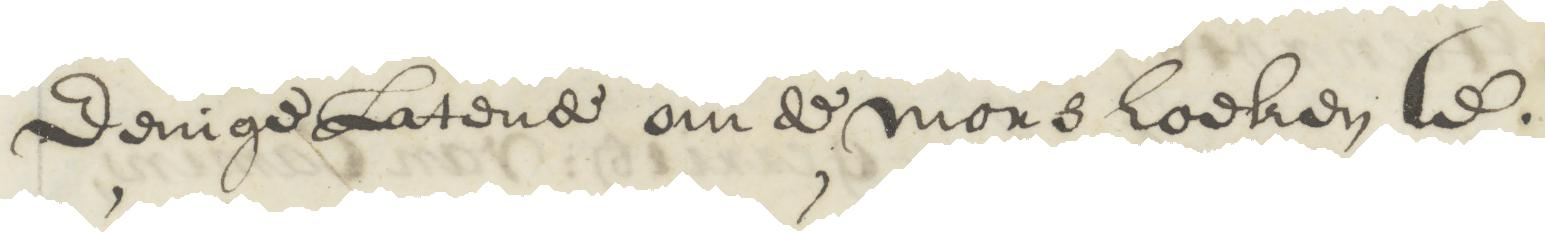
Eenige latende om de mors hoeken te.
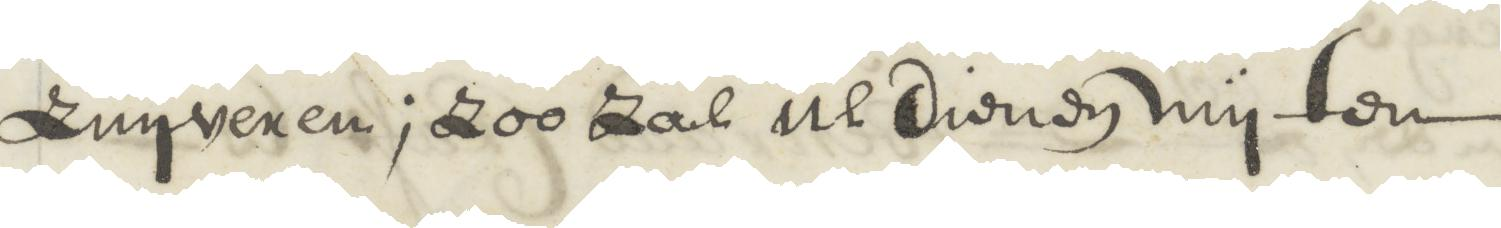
zuijveren; zoo zal ul dienen mij ten
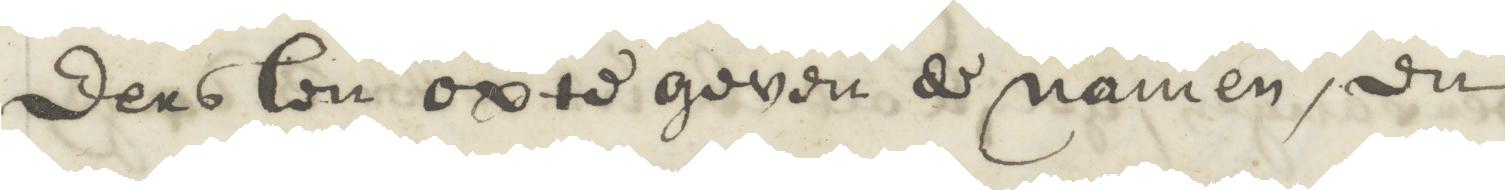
Eersten op te geven de namen, en
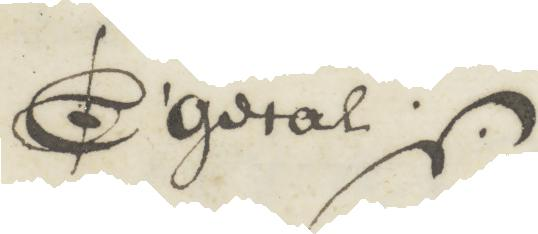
T'getal ./.
